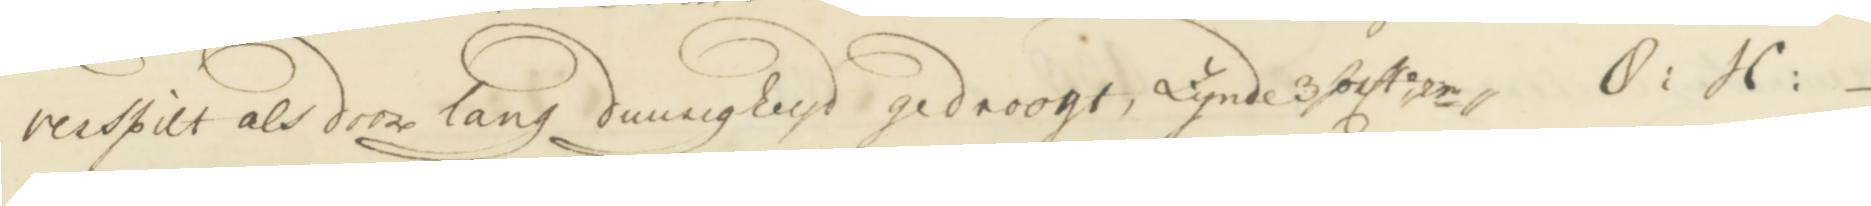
verspilt als door lang duurigheyd gedroogt, zynde 3 prc„to er„ 8: 15: —
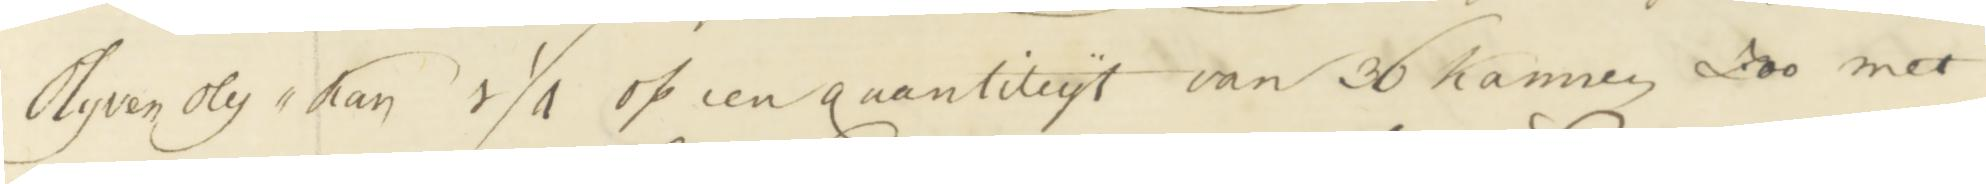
Olyven oly „ kan 1¼ op een quantiteijt van 36 kannen zoo met
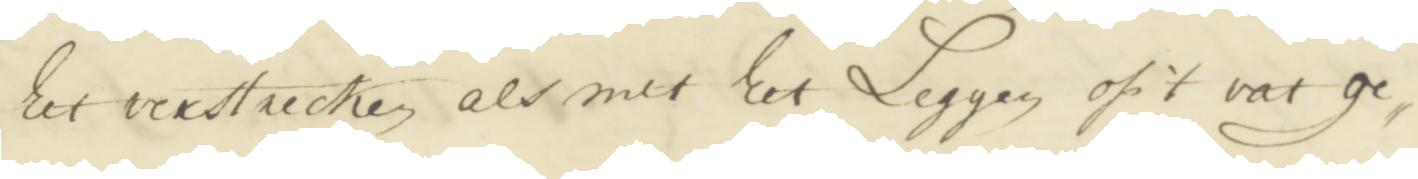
het verstrecken als met het Leggen op 't vat ge„
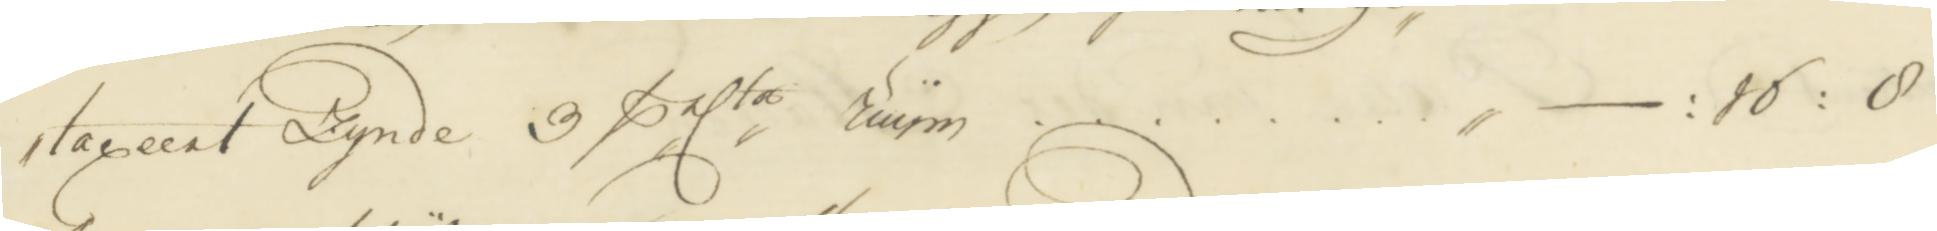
„taxeert zijnde 3 p„r c„to ruijm . . . . . . . . „ — : 16: 8
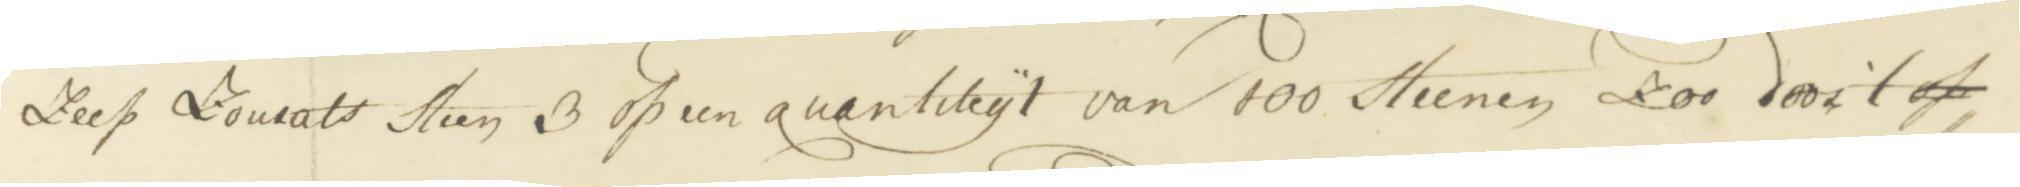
zeep zonrots steen 3 op een quantiteijt van 100 steenen zoo door ’t op„
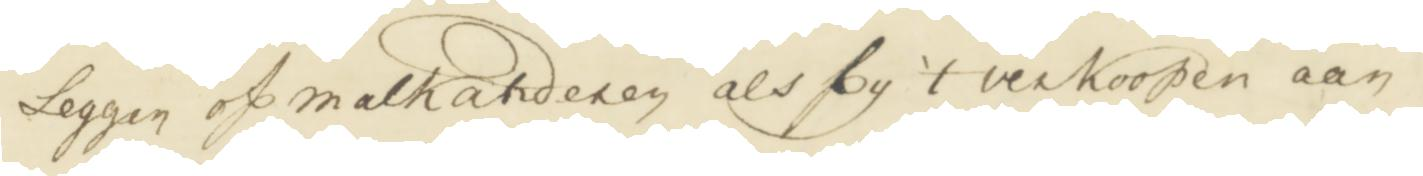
seggen op malkanderen als by ’t verkoopen aan
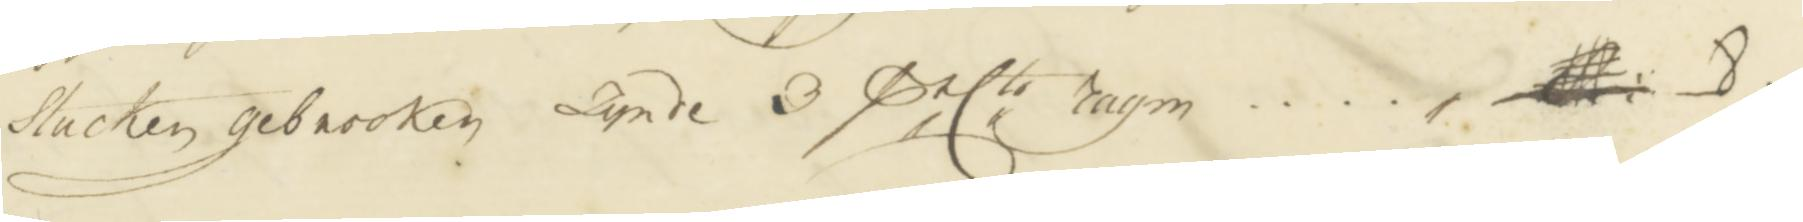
stucken gebrooken zynde 3 p„r c„to ruym . . . . „ 8: 8:
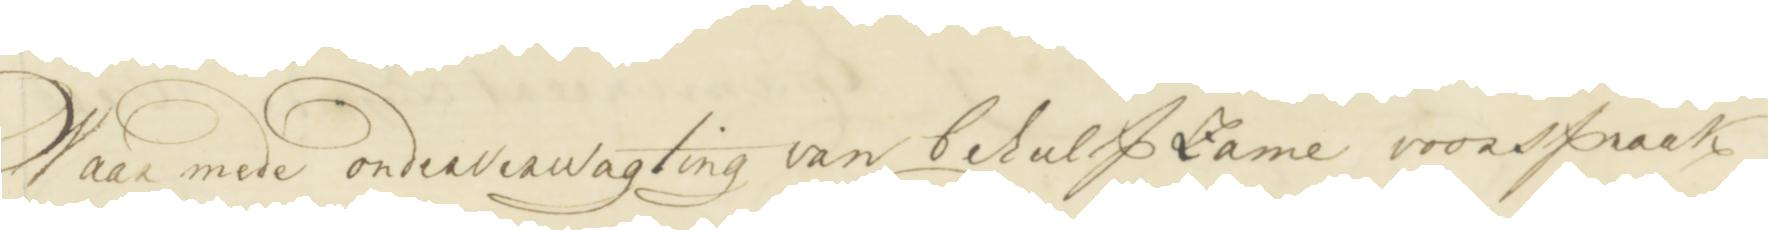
Waar mede onderverwagting van behulpzame voorspraak
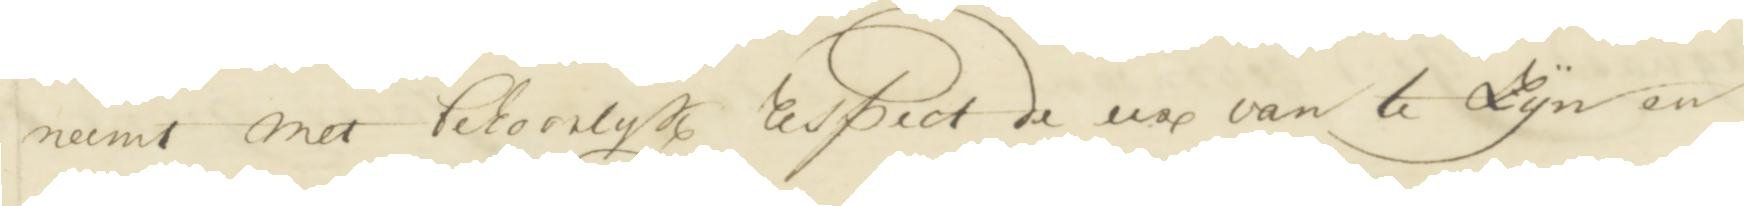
neemt met behoorlyk respect de wal van te zijn en
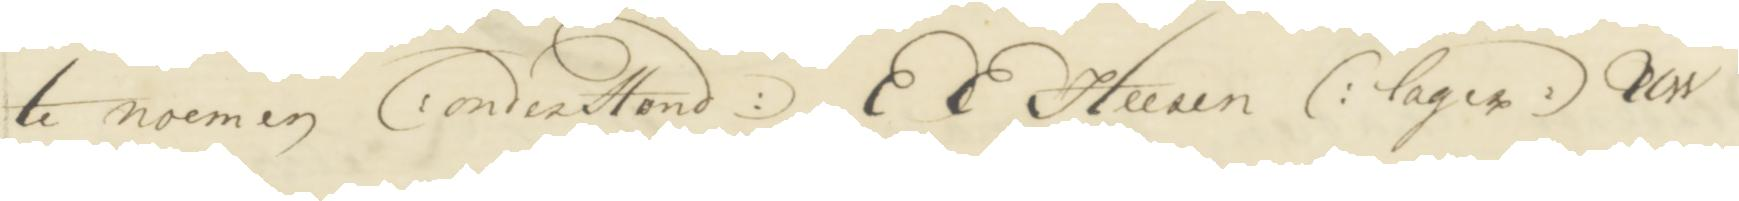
te noemen (:onderstond:) E E Heeren (:lager:) UW
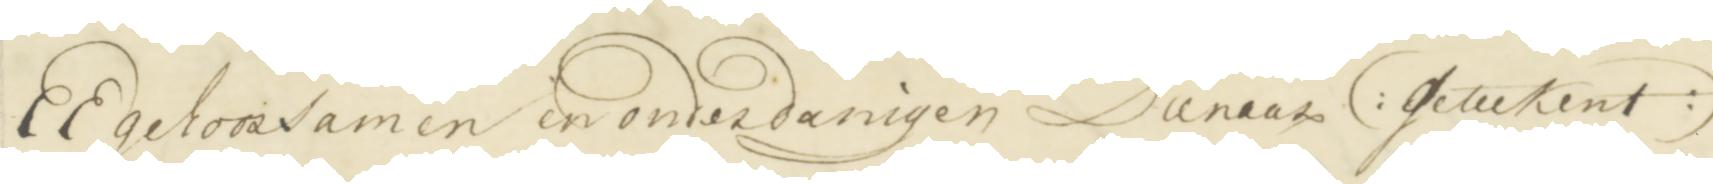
E E gehoorsamen en onderdanigen Dienaar (:geteekent:)
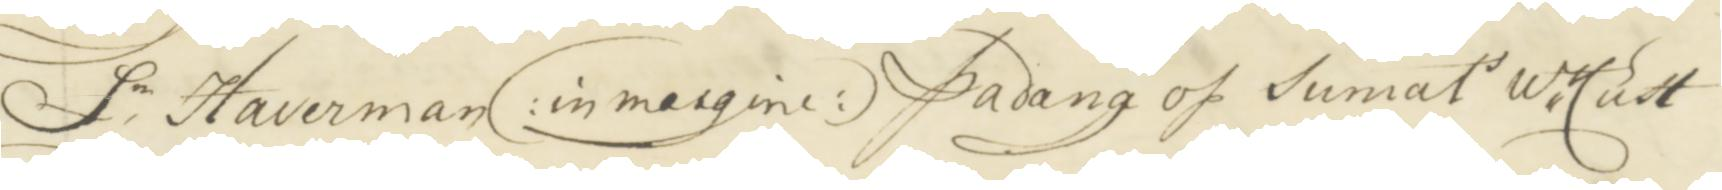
S,r Haverman (:in margine:) Padang op Sumats w„t Cust
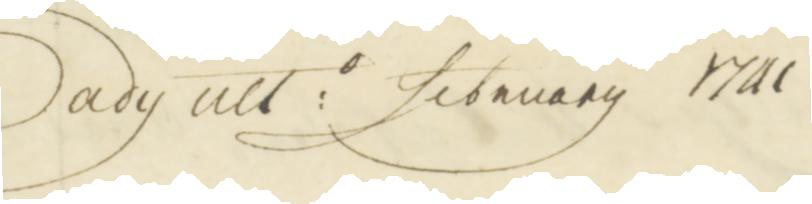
ady ult:o february 1741
